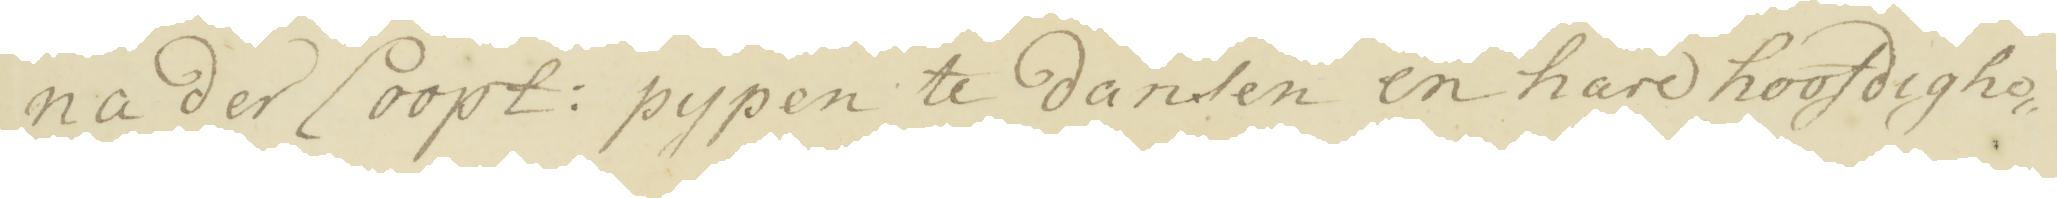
na der Coopl: pypen te dansen en hare hoofdighe„
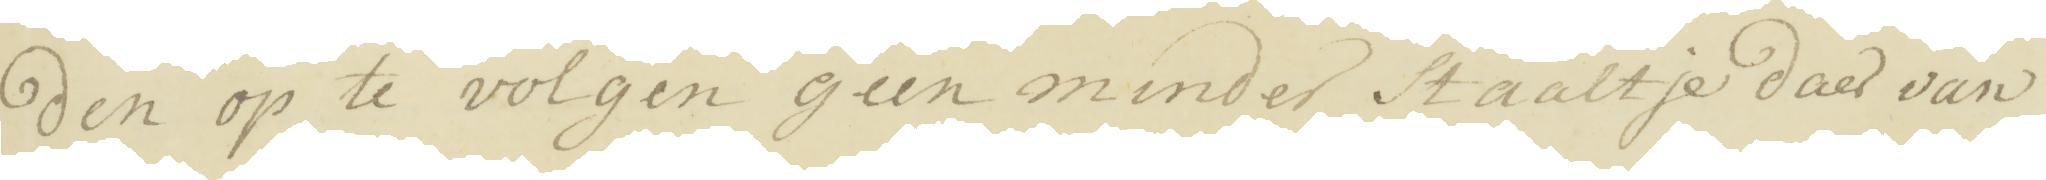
den op te volgen geen minder staaltje daer van
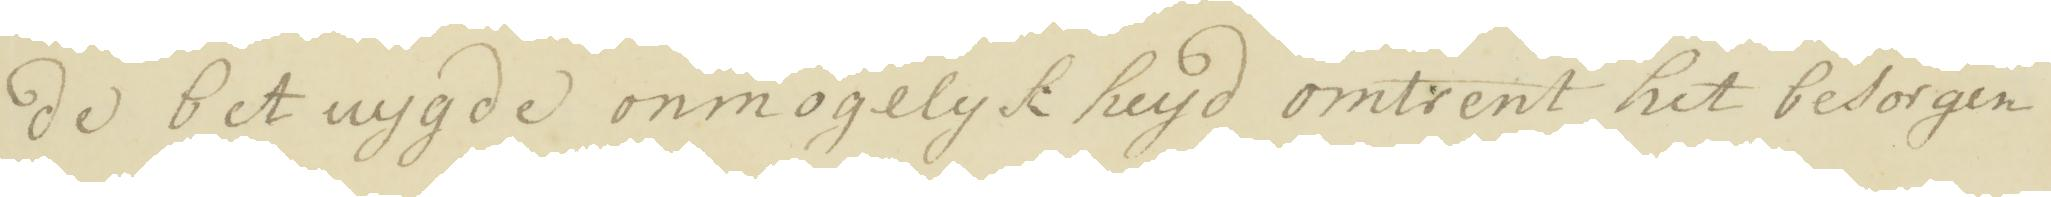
de betuygde onmogelykheyd omtrent het besorgen
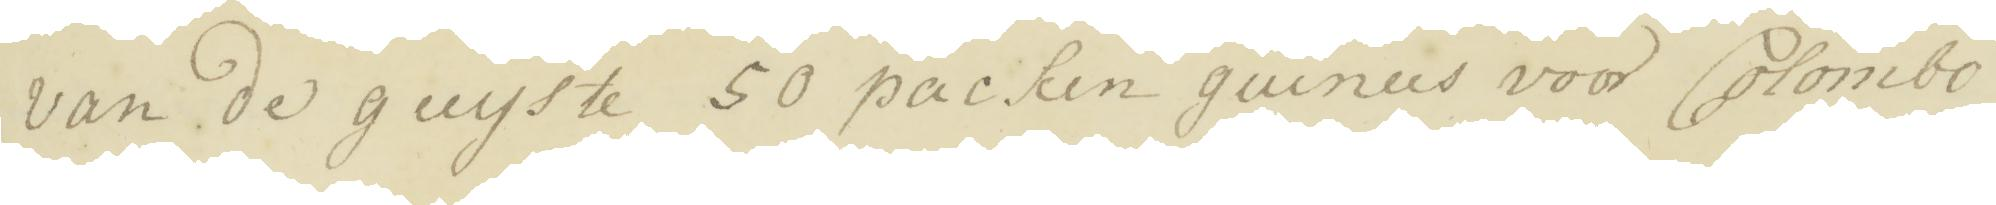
van de geeyste 50 packen guinees voor Colombo
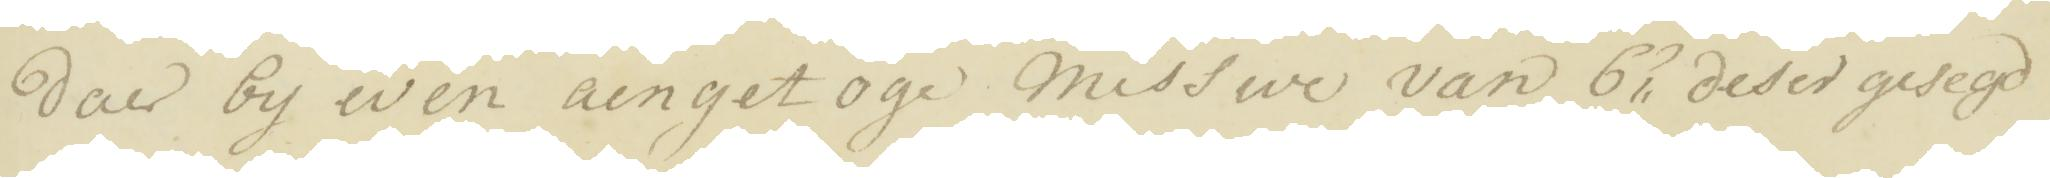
daer by even aengetoge missive van 6„' deser gesegd
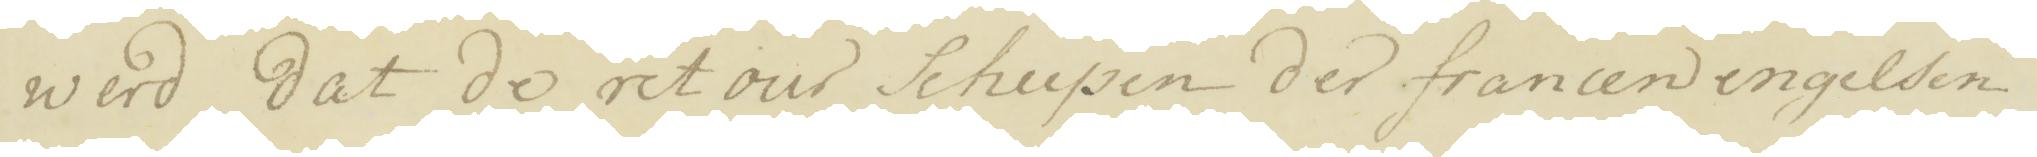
werd dat de retour scheepen der francen engelsen
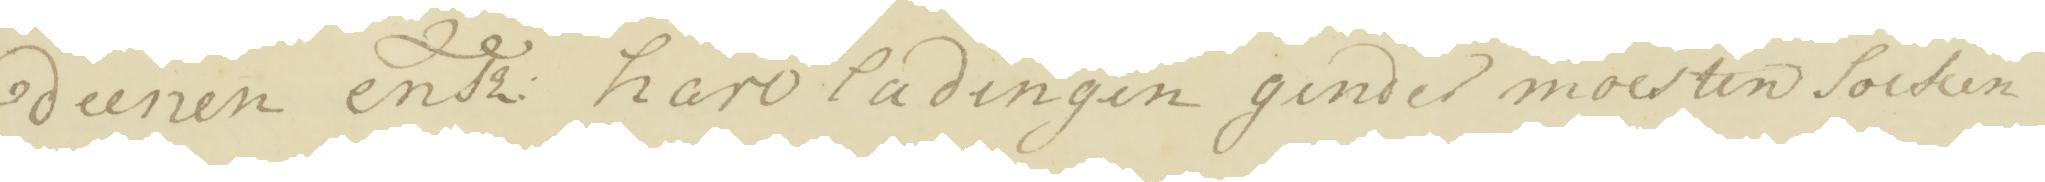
deenen ensz: hare ladingen ginder moesten soeken
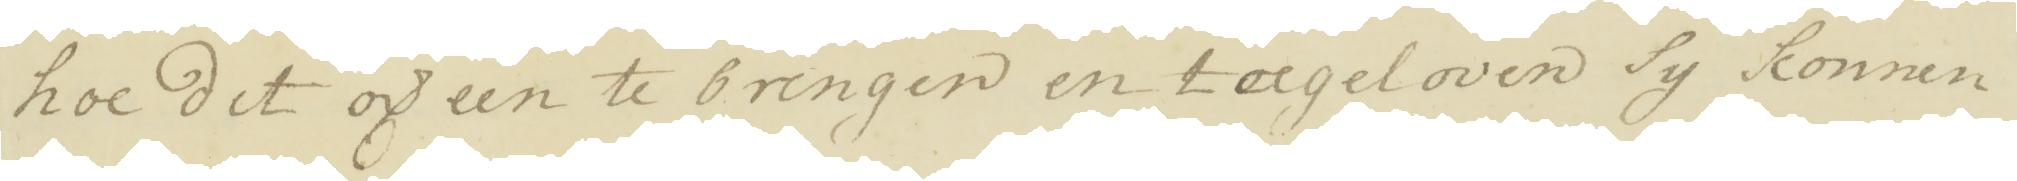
hoe dit over een te bringen en toegeloven sy konnen
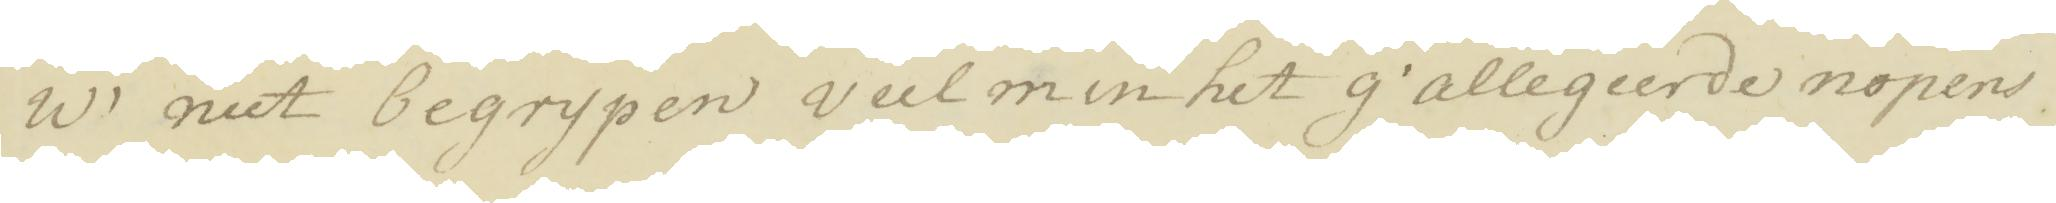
w' niet begrypen veel min het g'allegeerde nopens
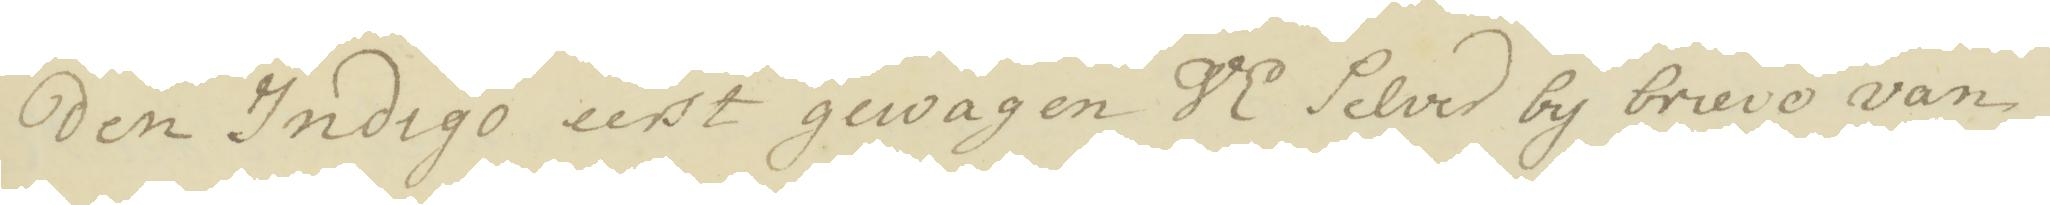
den Indigo eerst gewagen VE selver by brieve van
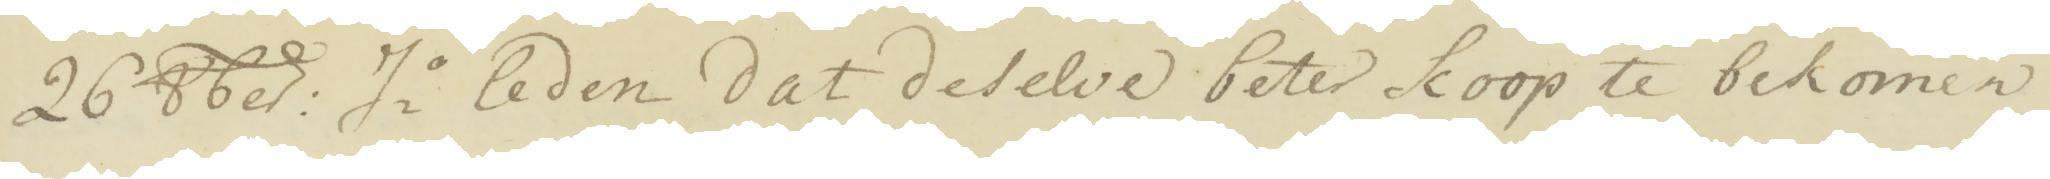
26 8ber: J=o leden dat deselve beter koop te bekomen
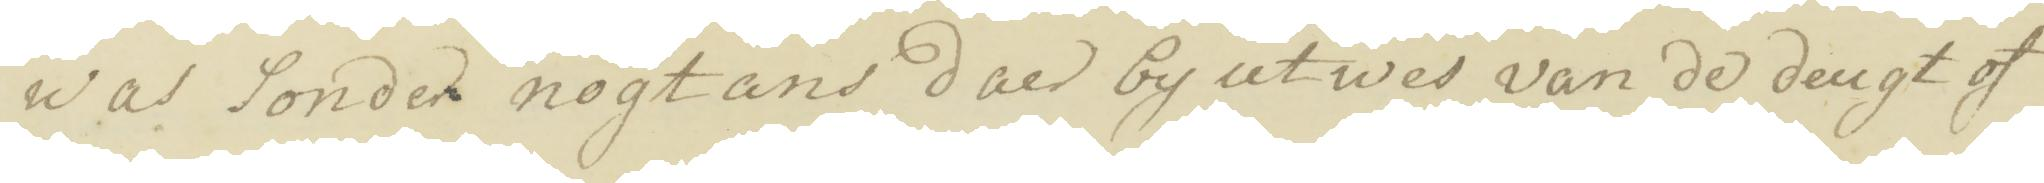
was sonder nogtans daer by iet wes van de deugt of
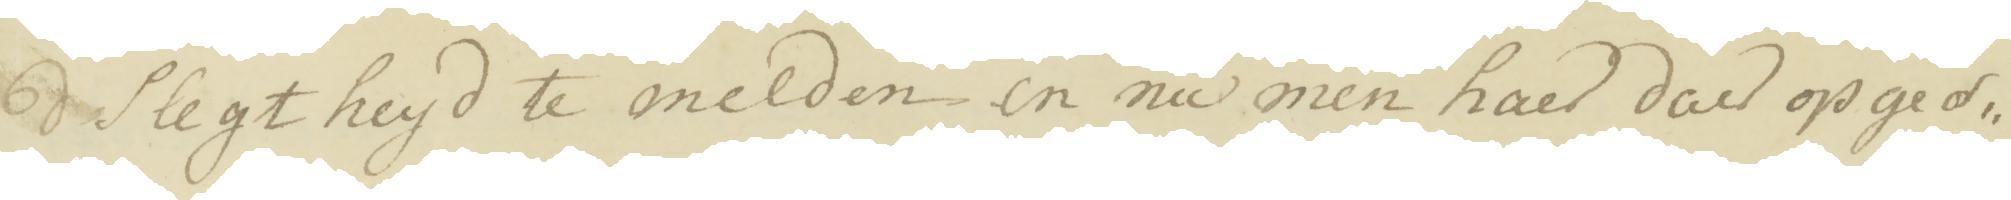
d slegtheyd te melden en nu men haer daer op geor„
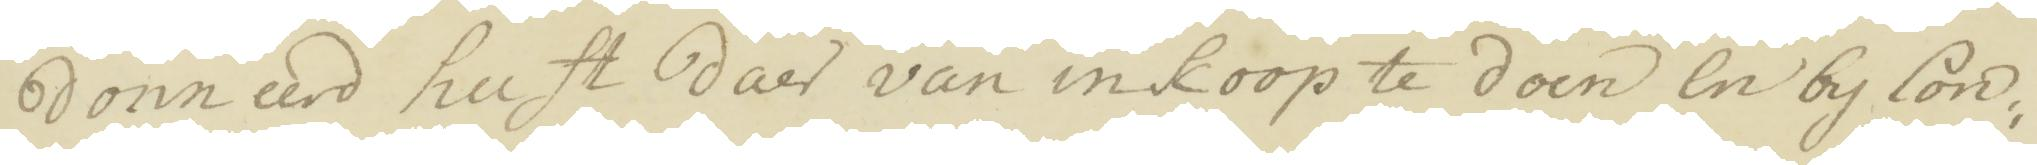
donneerd heeft daer van inkoop te doen en by Con„
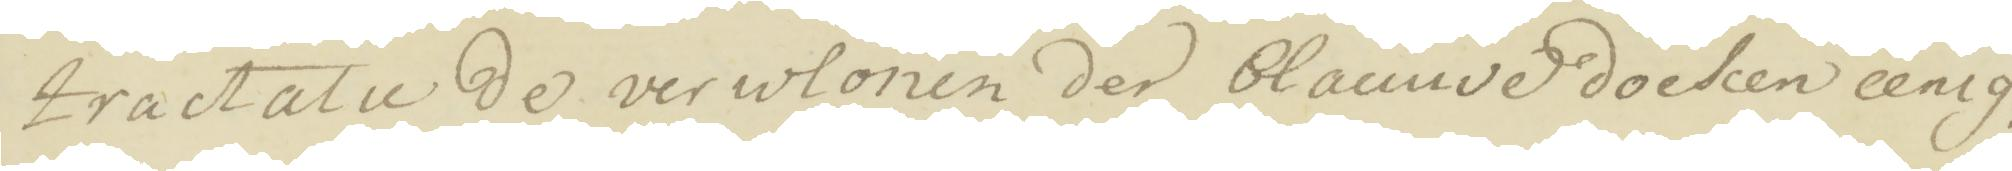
tractatie de verwlonen der blauwe doeken eenig
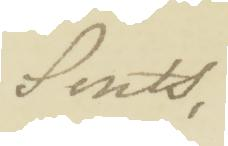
sints,
